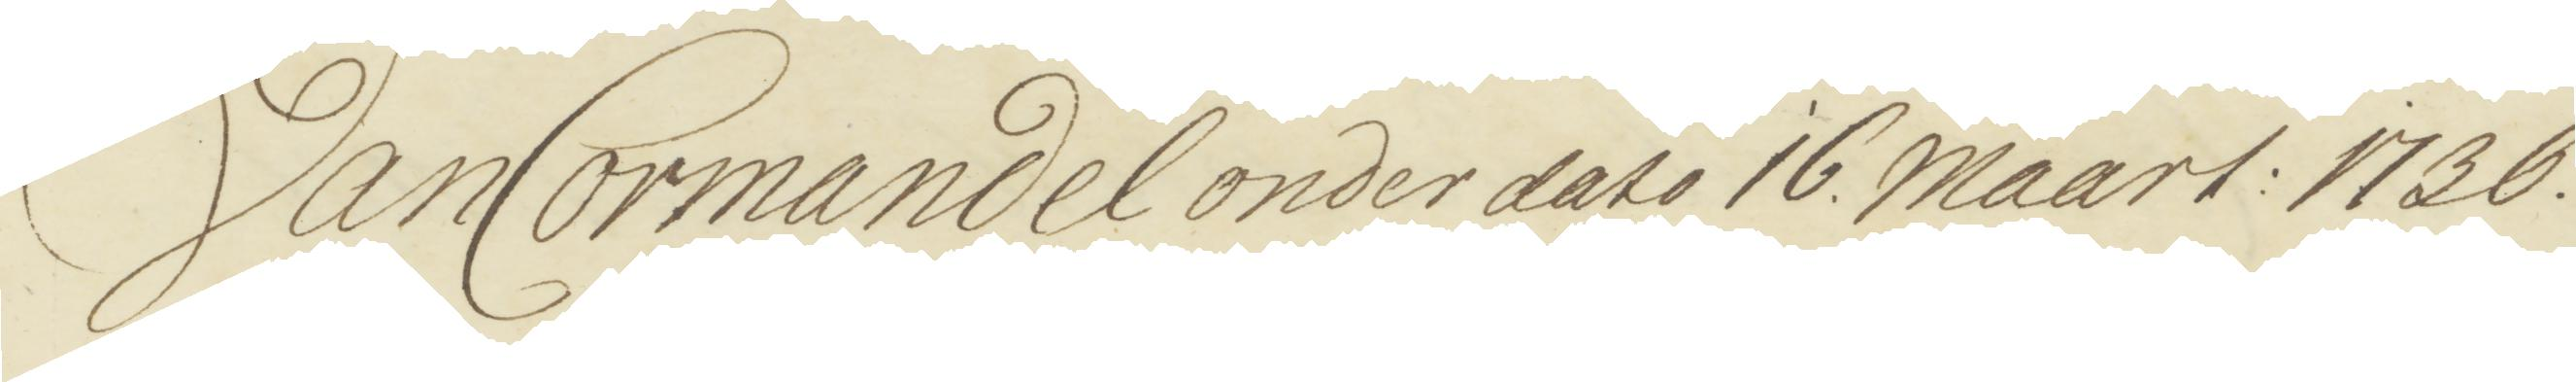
Van Cormandel onder dato 16. Maart: 1736.
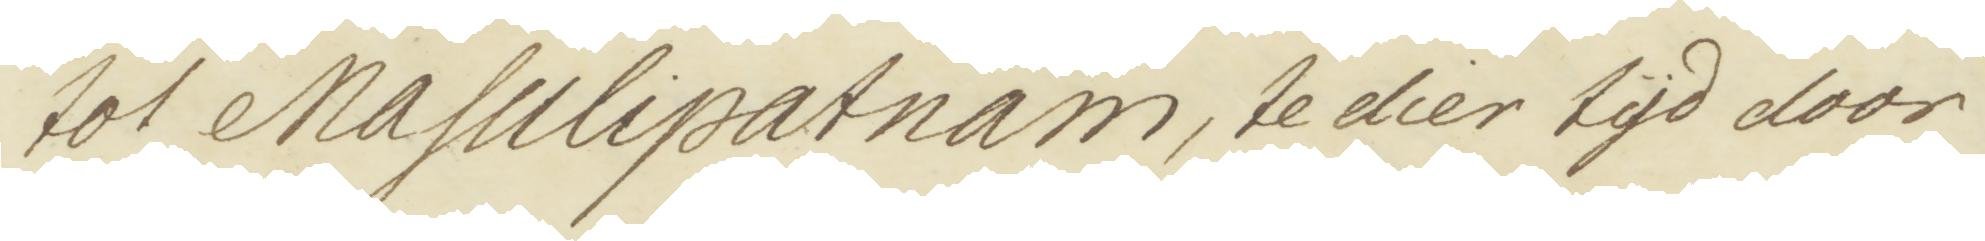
tot Masulipatnam, te dier tijd door
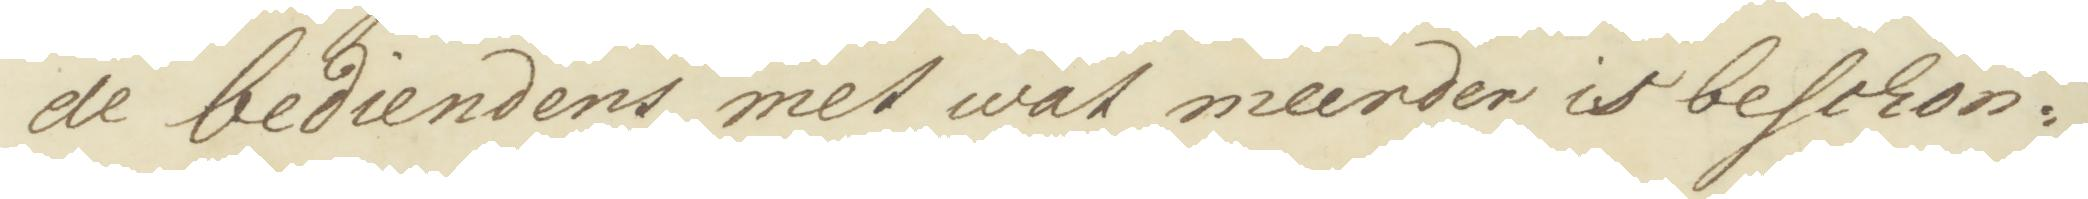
de bediendens met wat meerder is beschon„
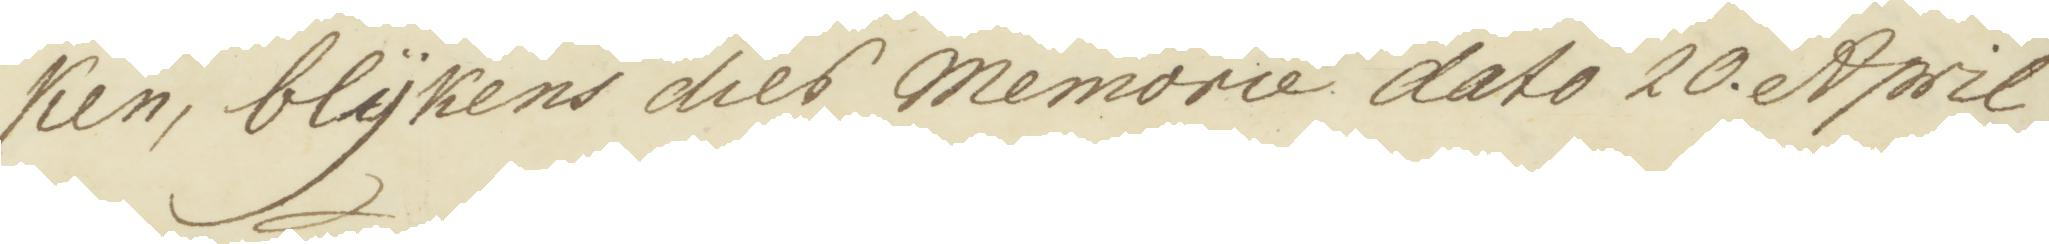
ken, blijkens dies memorie dato 20. April
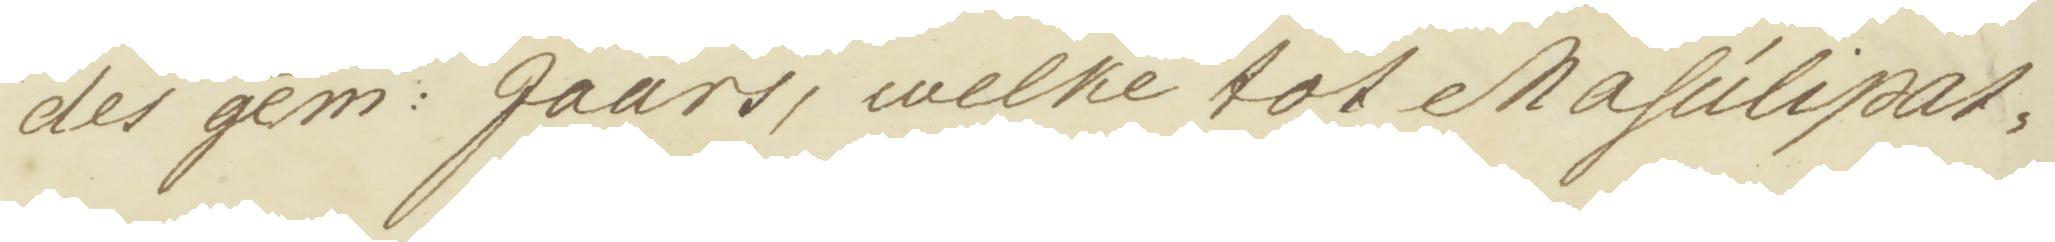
des gem: Jaars, welke tot Masulipat„
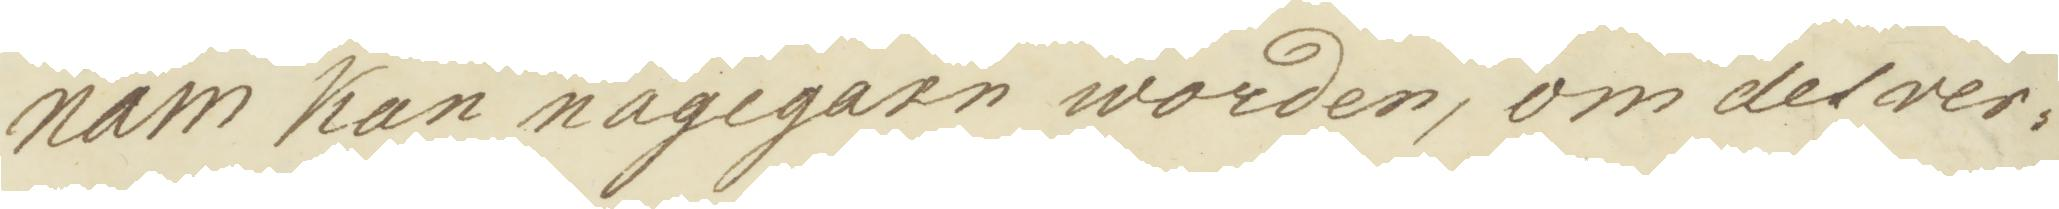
nam kan nagegaan worden, om des ver„
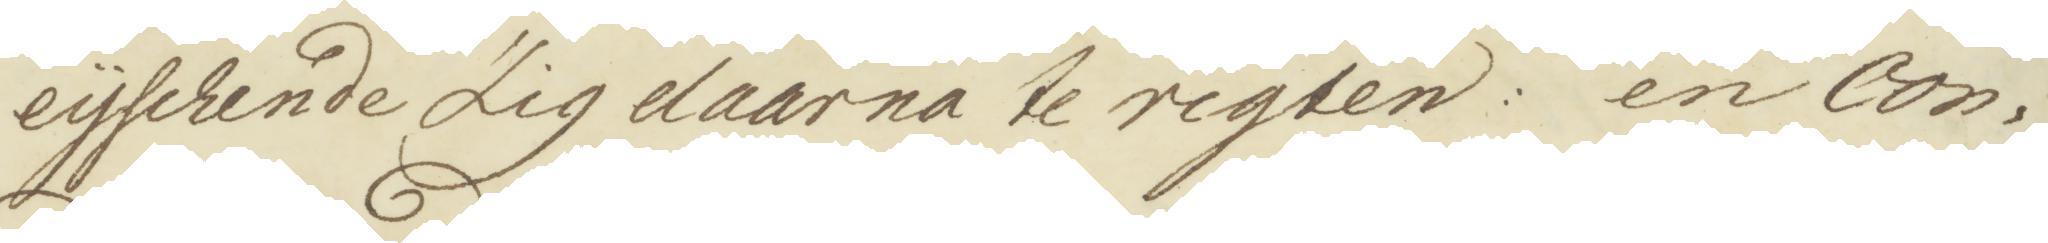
eijschende zig daarna te rigten: en con„
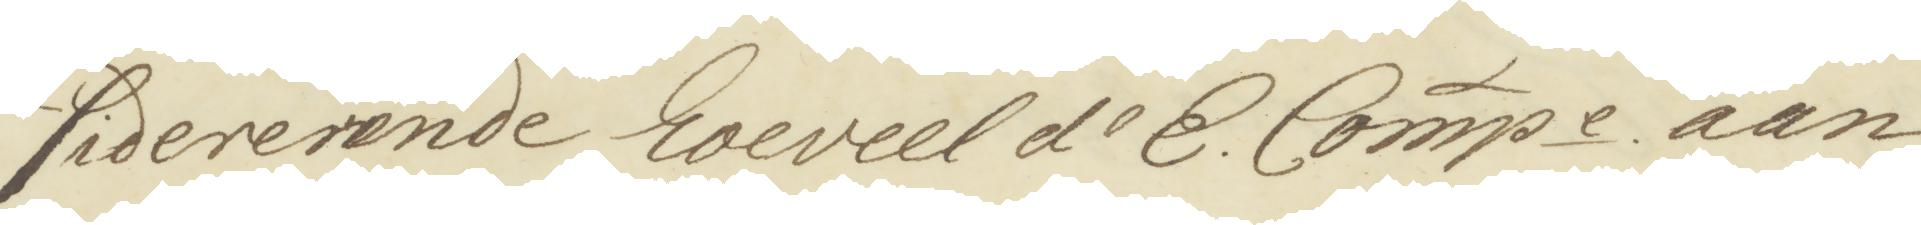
sidererende hoeveel d’ E. Comp-e aan
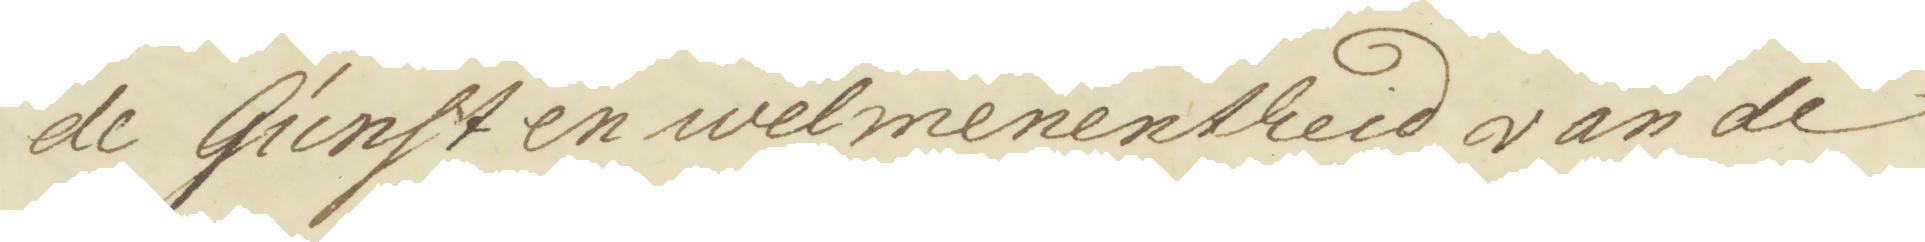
de Gunst en wel menentheid van de
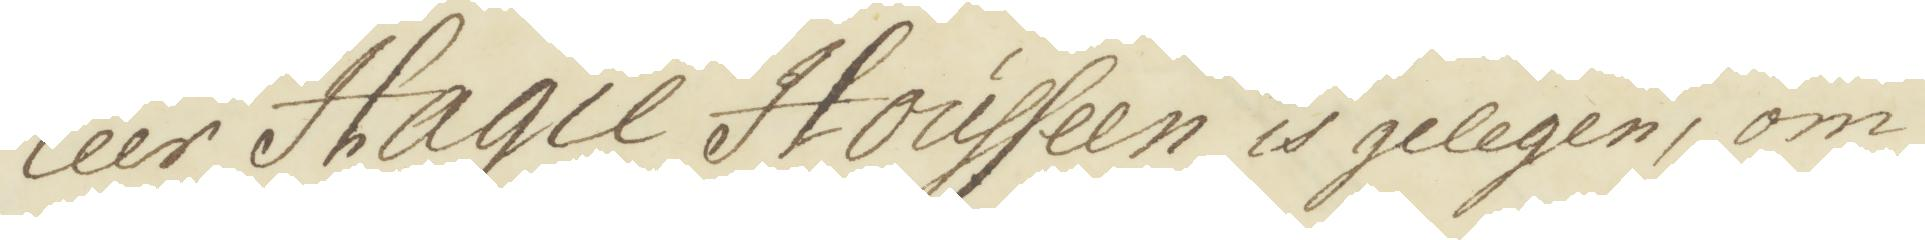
heer Hagie Housseen is gelegen, om
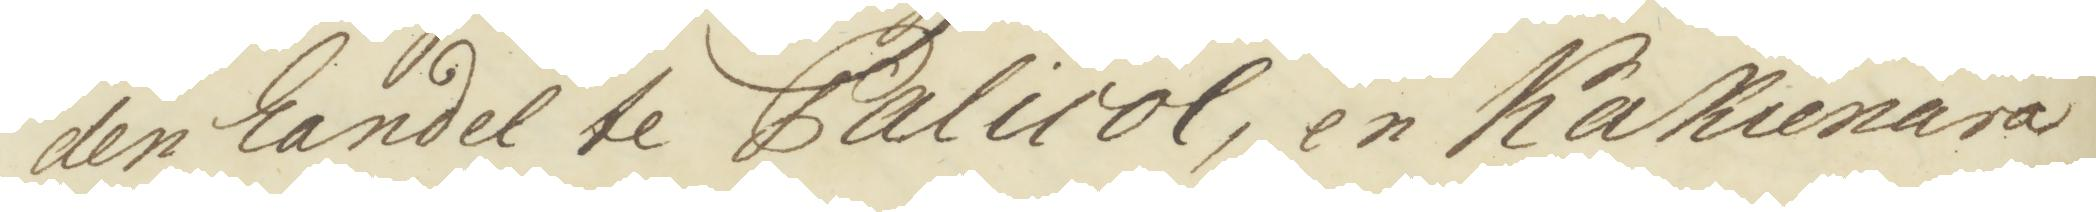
den handel te Palicol, en Kakienara
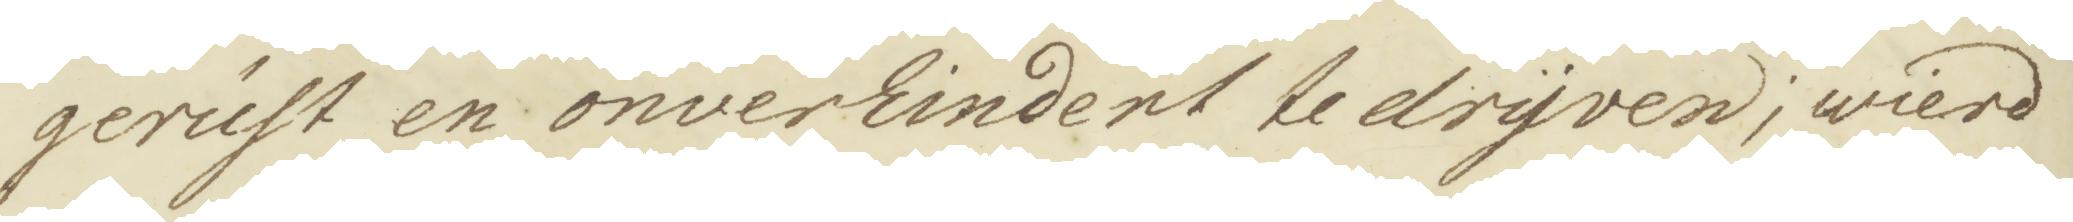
gerust en onverhindert te drijven; wierd
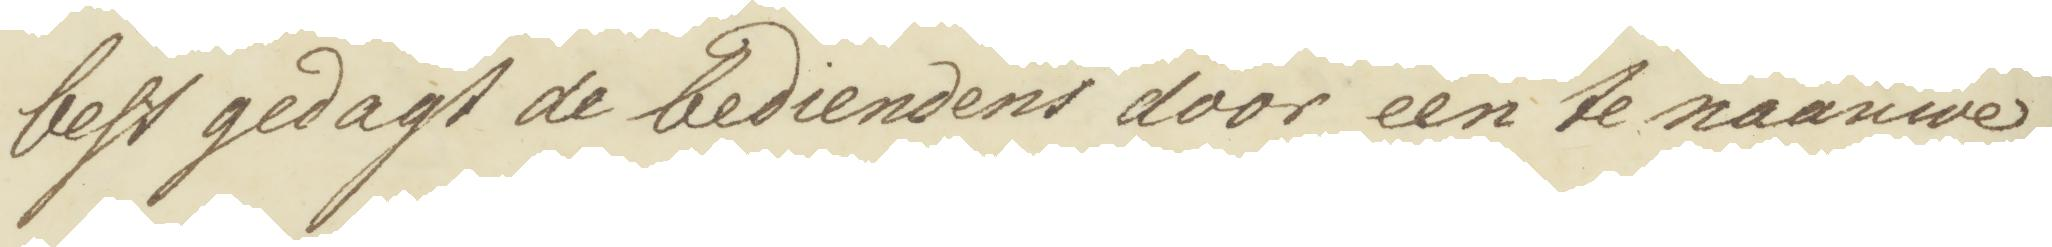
best gedagt de bediendens door een te naauwe
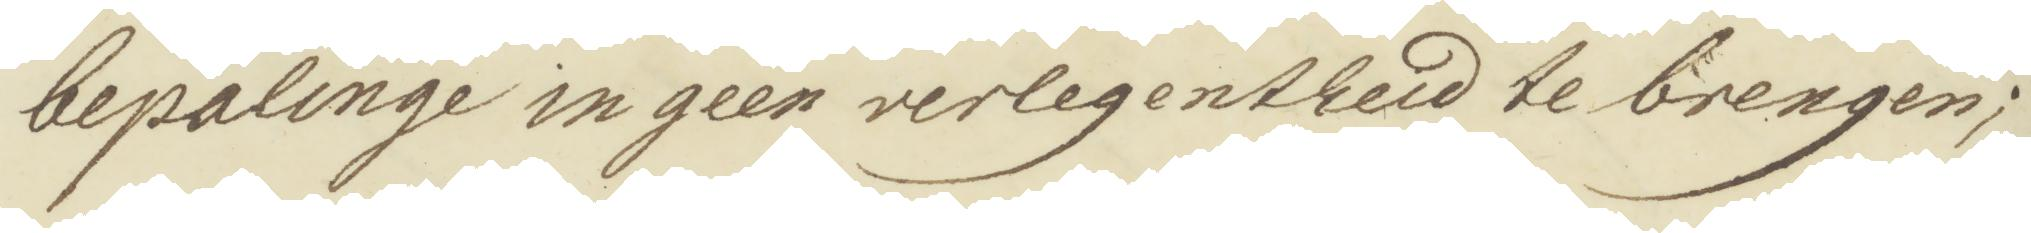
bepalinge in geen verlegentheid te brengen;
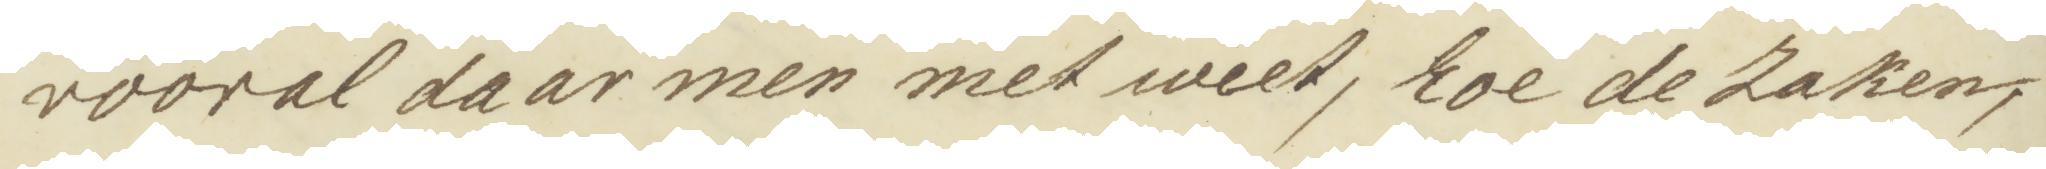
vooral daar men niet weet, hoe de zaken,
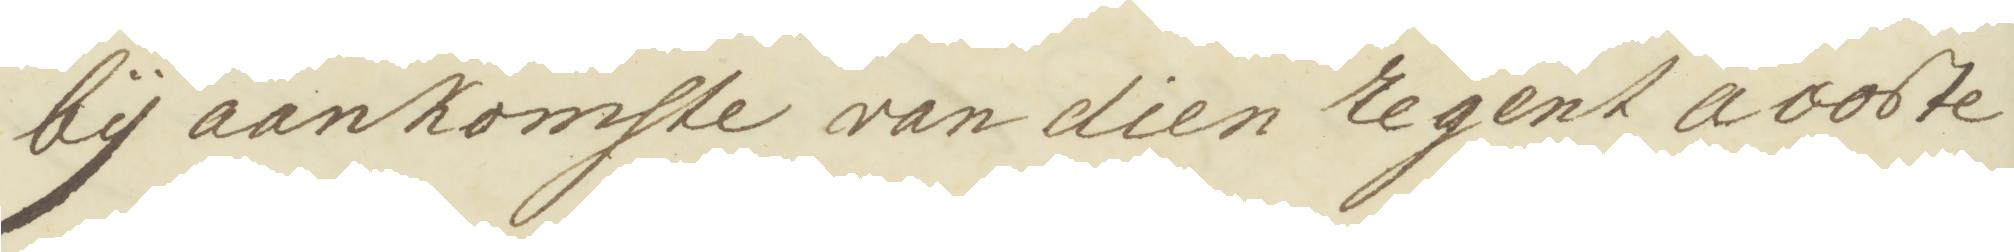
bij aankomste van dien regent â ooste
